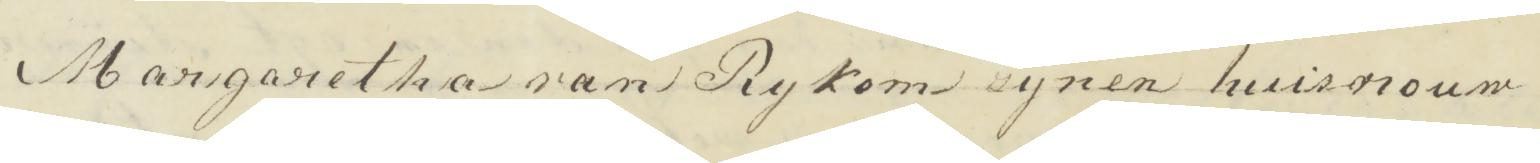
Margaretha van Rykom zynen huisrouw
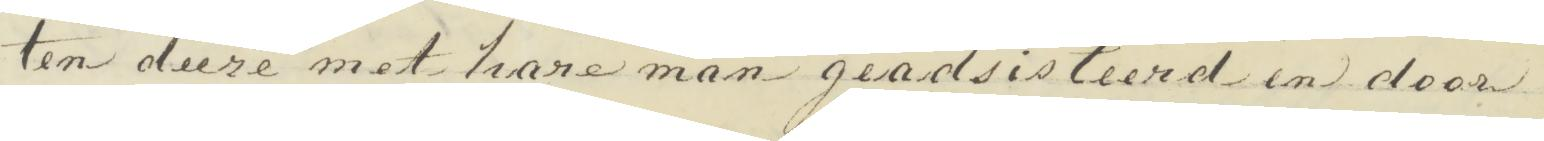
ten deeze met hare man geadsisteerd en door
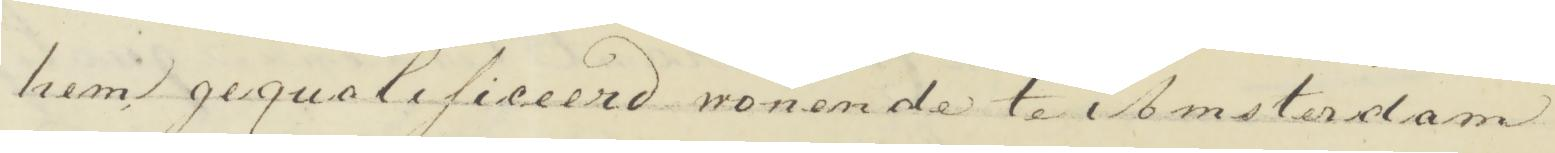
hem gequalificeerd wonende te Amsterdam
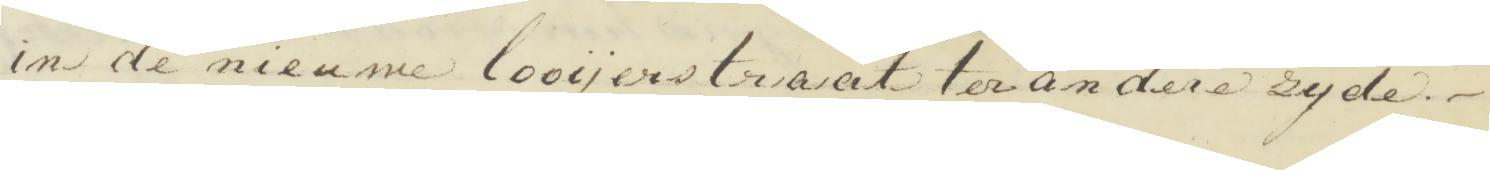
in de nieuwe looijerstraat ter andere zyde.-
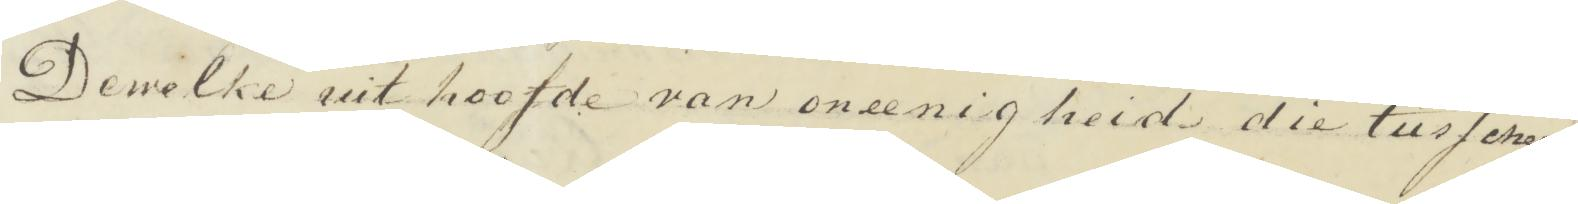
Dewelke uit hoofde van oneenigheid die tusschen
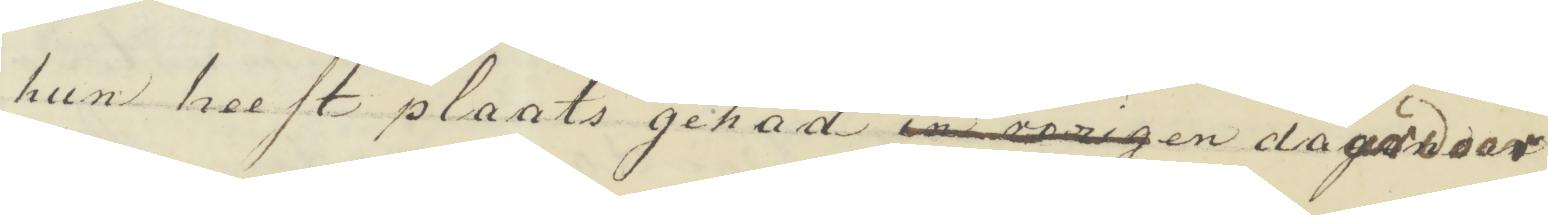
hun heeft plaats gehad in vorigen daar haar
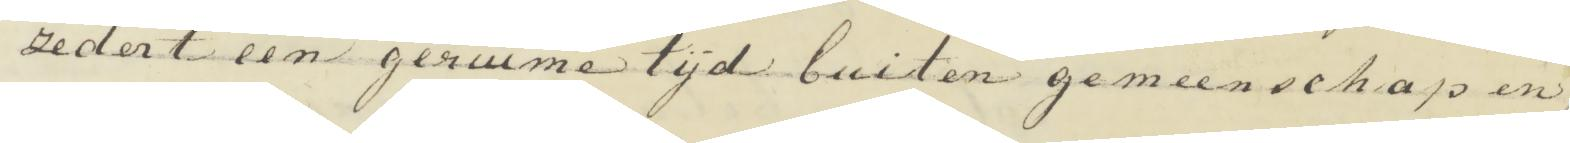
zedert een geruime tijd buiten gemeenschap en
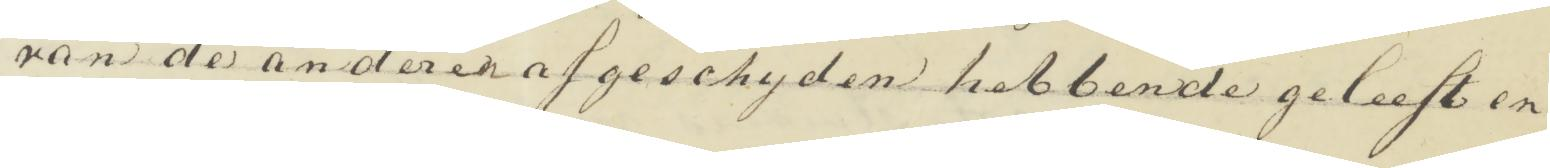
van de anderen afgeschyden hebbende geleeft en
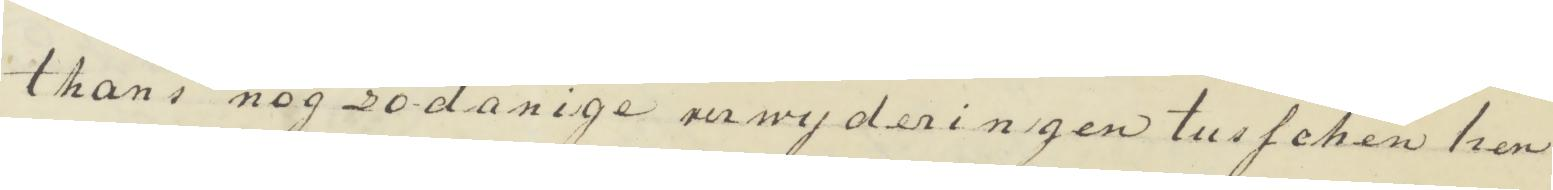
thans nog zodanige verwyderingen tusschen hen
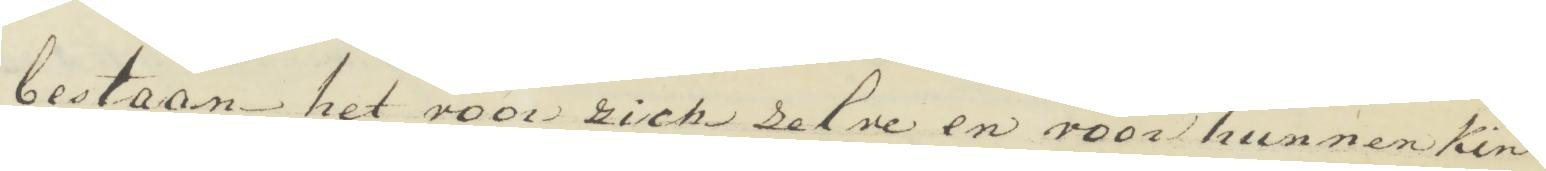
bestaan - het voor zich zelve en voor hunnen kin
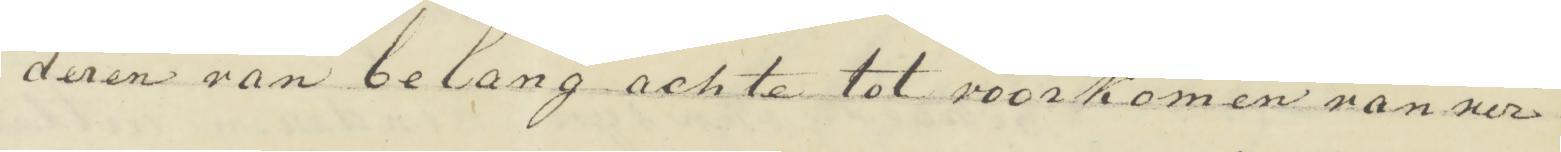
deren van belang achte tot voorkomen van ver
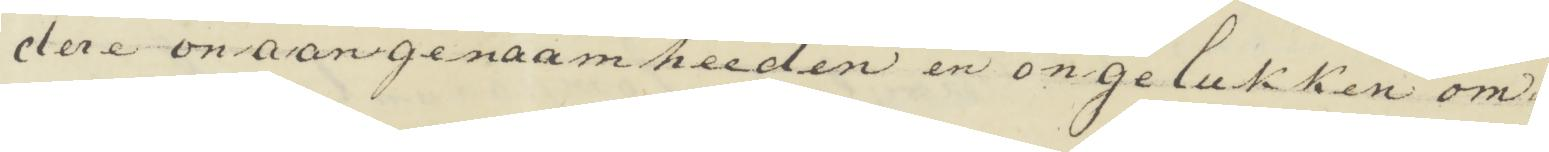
dere onaangenaam heeden en ongelukken om„
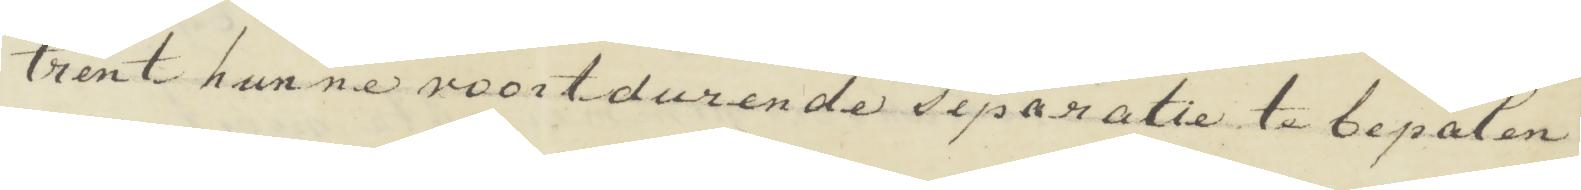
trent hunne voortdurende separatie te bepalen
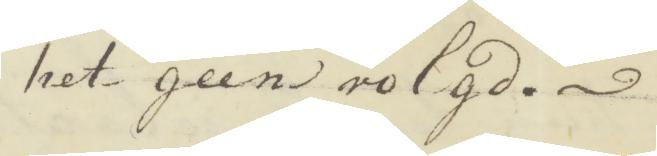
het geen volgd.—
